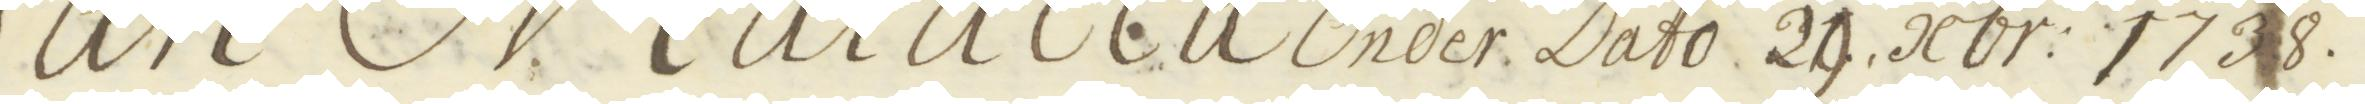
Van Malacca Onder Dato 29. xbr: 1738.
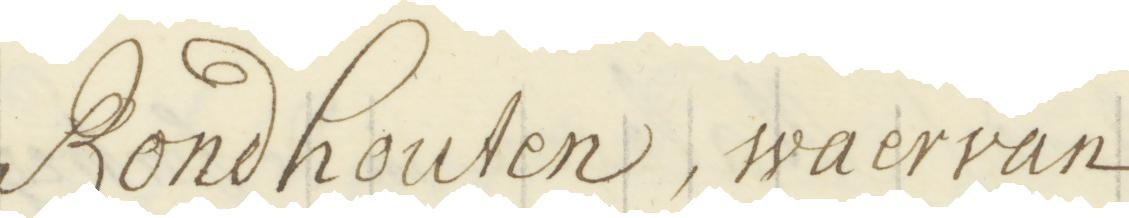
16. p=s . . Rondhouten, waervan.
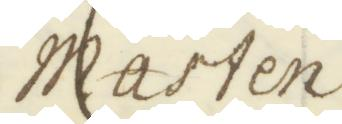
13. p=s Masten als.
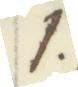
1. ps lb. . 1 laag. 97. v=t dik 27½ p=m d'top 21. p=m
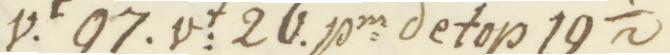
v.t 97. v:t 26. p:m de top 19½
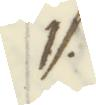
1. „ „ . 2. „ 108. „ „ 27. „ „ „ 21. „
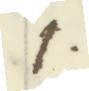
1. „ „ . 3. „ 97. „ „ 24½ „ „ „ 20½ „
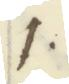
1. „ „ . 4. „ 95. „ „ 24. „ „ „ 18. „ „ 85 „ 24 „ „ „ 18 . – .
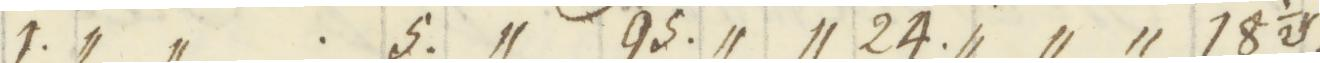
1. „ „ . 5. „ 95. „ „ 24. „ „ „ 18½ „
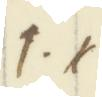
1. „ „ . 6. „ 89. „ „ 22. „ „ „ 19.
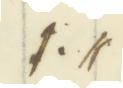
1. „ „ . 7. „ 89. „ „ 22. „ „ „ 18. „ „ 79 „ 22 „ „ „ 16½.
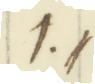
1. „ „ . 8. „ . 90. „ „ 22. „ „ „ . 18 „
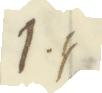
1. „ „ . 9. „ 90. „ „ 21 „ „ „ 16 „ „ 79 „ 21 „ „ „ 15¾.
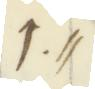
1. „ „ . 10 „ 83. „ „ 19 „ „ „ 15½ „ „ 77 „ 19 „ „ „ 14¼.
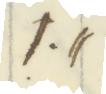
1. „ „ . 11. „ 76. „ „ 13. „ „ „ . .
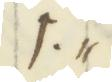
1. „ „ . 12. „ 74. „ „ 13 „ „ „ : : „ 58 „ 13 „
